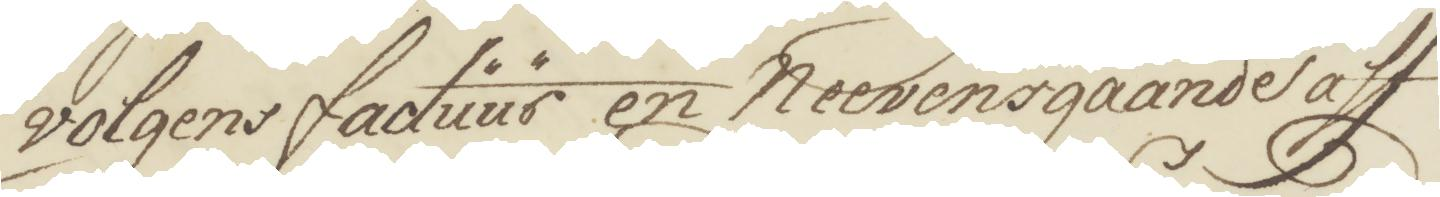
volgens factuur en neevensgaande aff
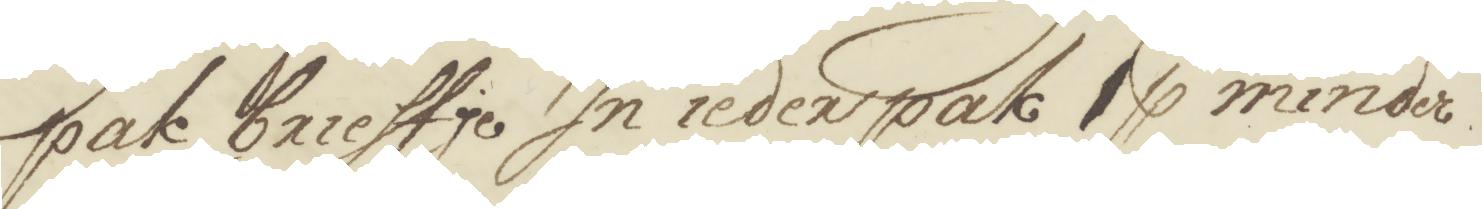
pak brieffije jn ieder pak 1 ps minder
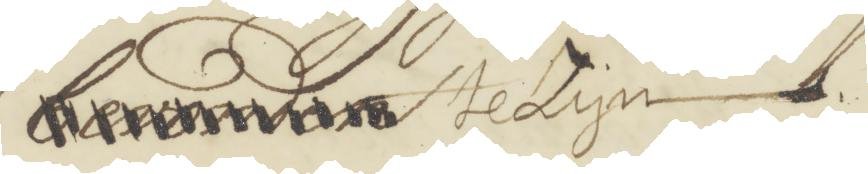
bevonden te zijn.
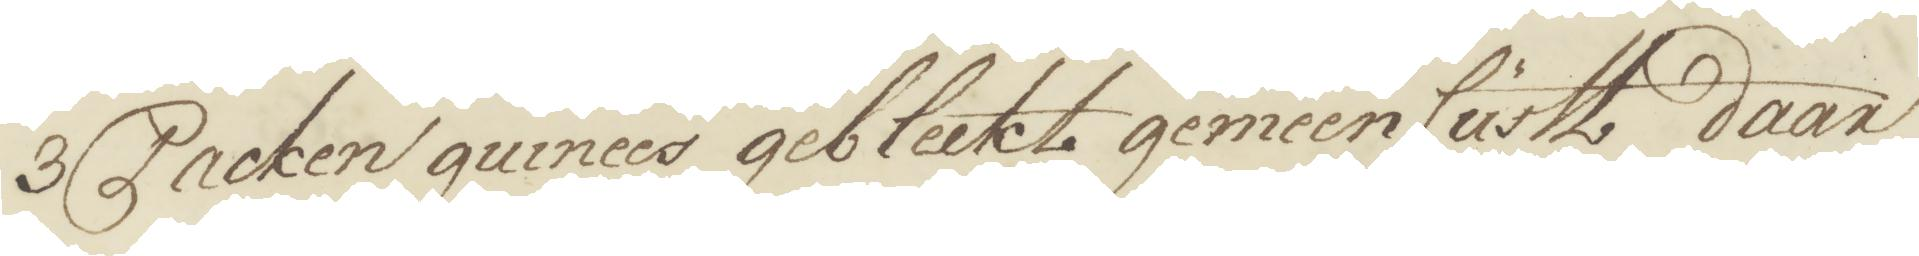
3 Packen guinees gebleekt gemeen Custt daar
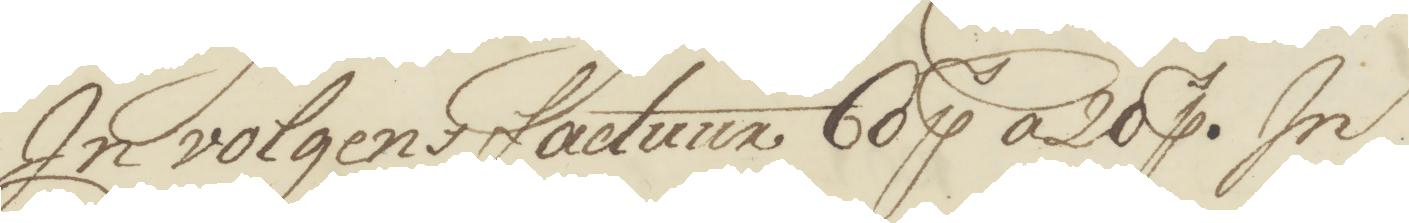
jn volgens factuur 68 ps a 20 p.s jn
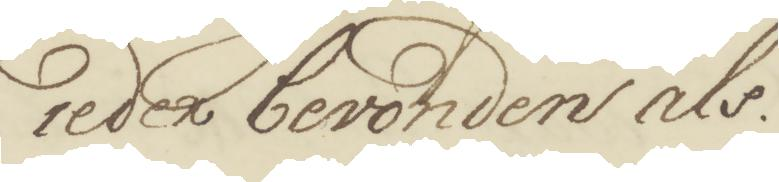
ieder bevonden als.
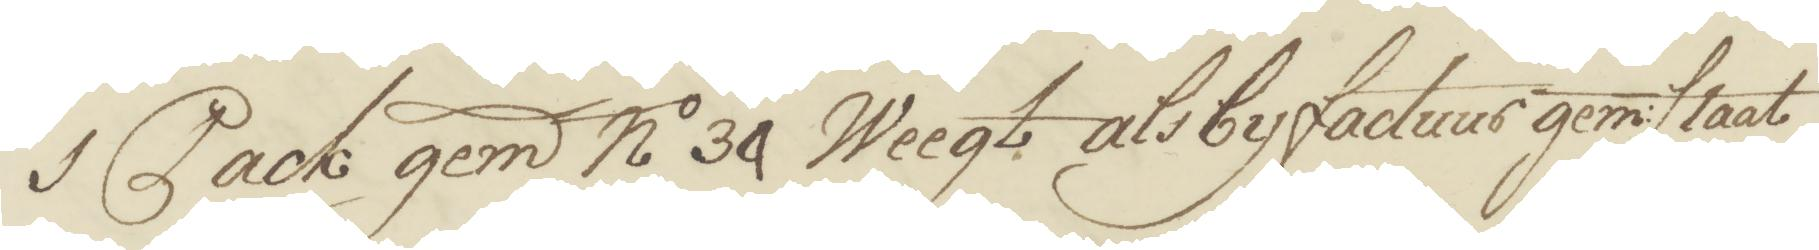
1 Pack gem no 34 Weegt. als by factuur gem: staat
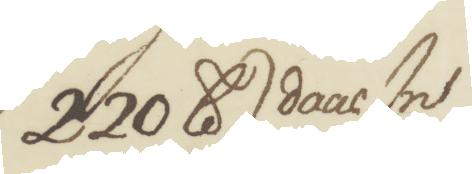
220 lb daar jn
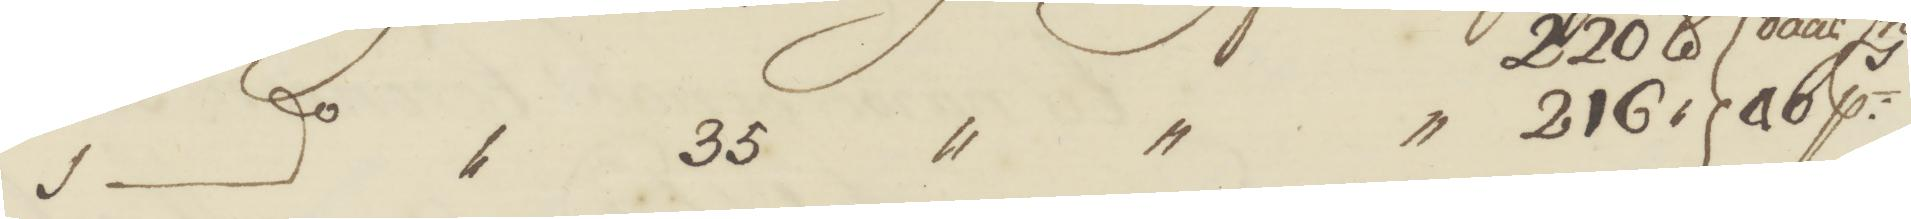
1 _o „ 35 „ „ „ 216 „ 40 p:-s
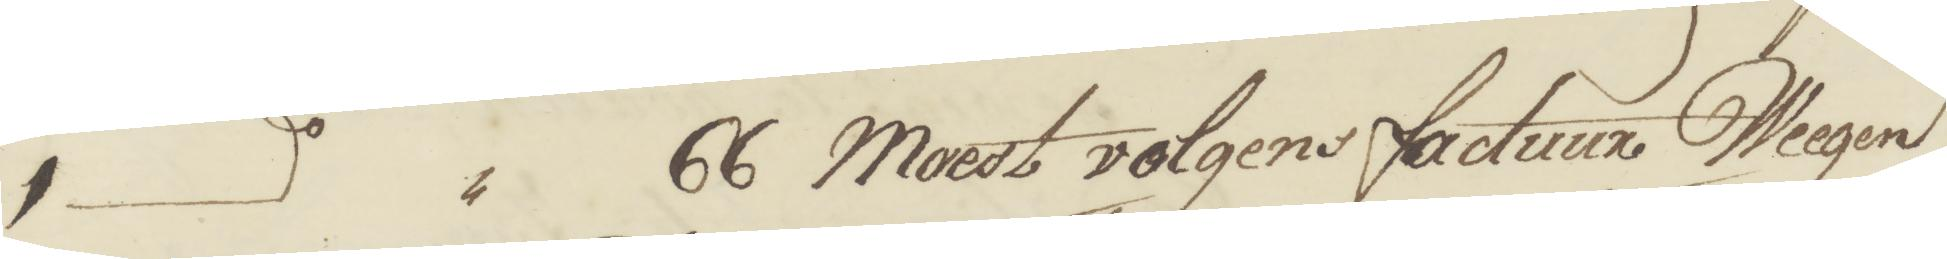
1 _o „ 66 moest volgens factuur Weegen
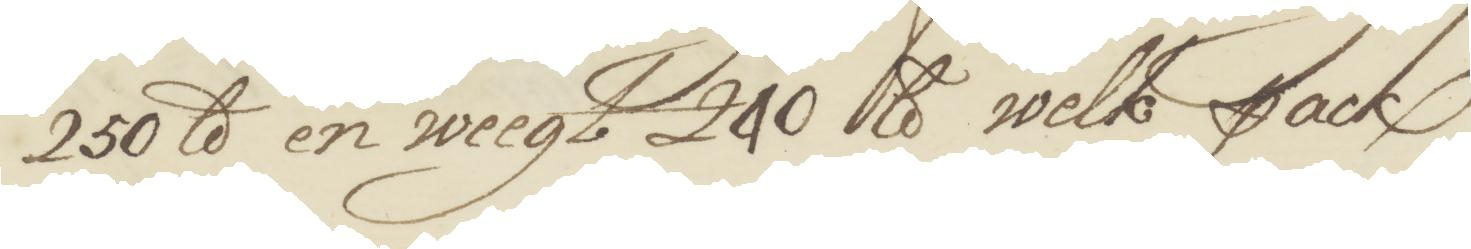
250 lb en weegt 240 lb welk pack
